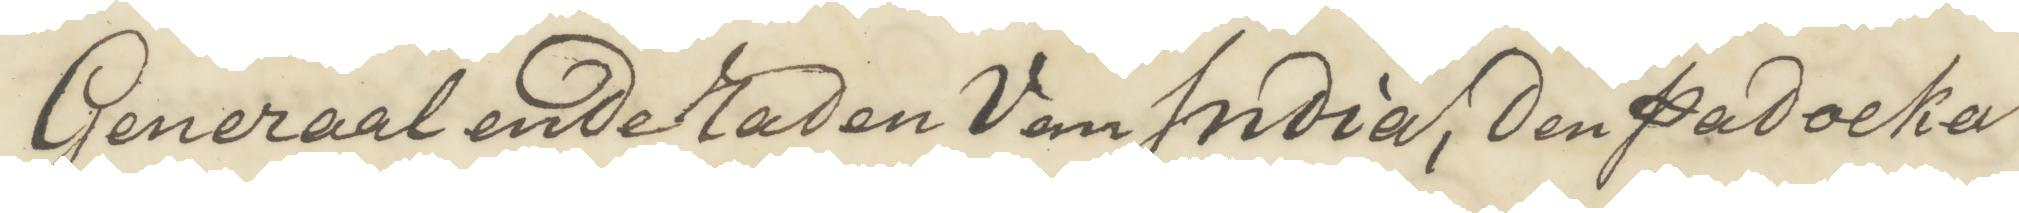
Generaal ende raden van Jndia, den padoeka
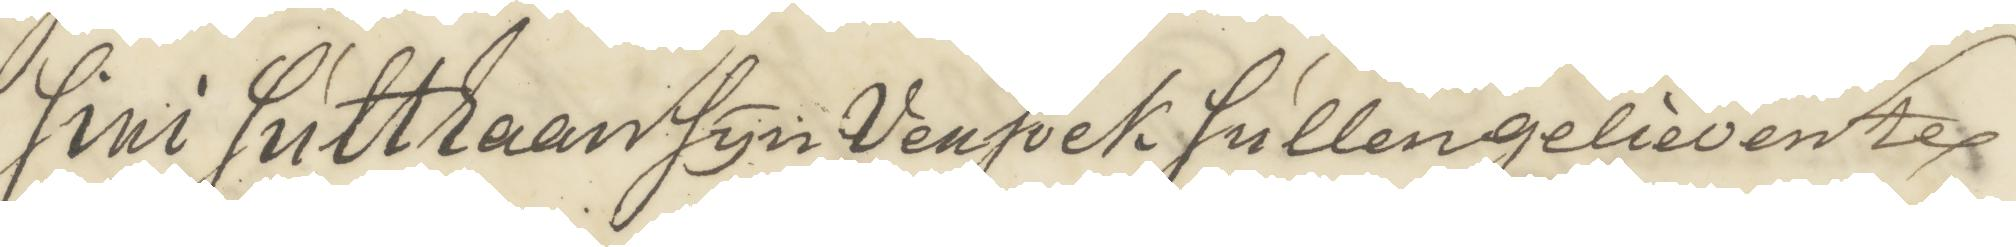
siri sulthaan sijn versoek sullen gelieven te
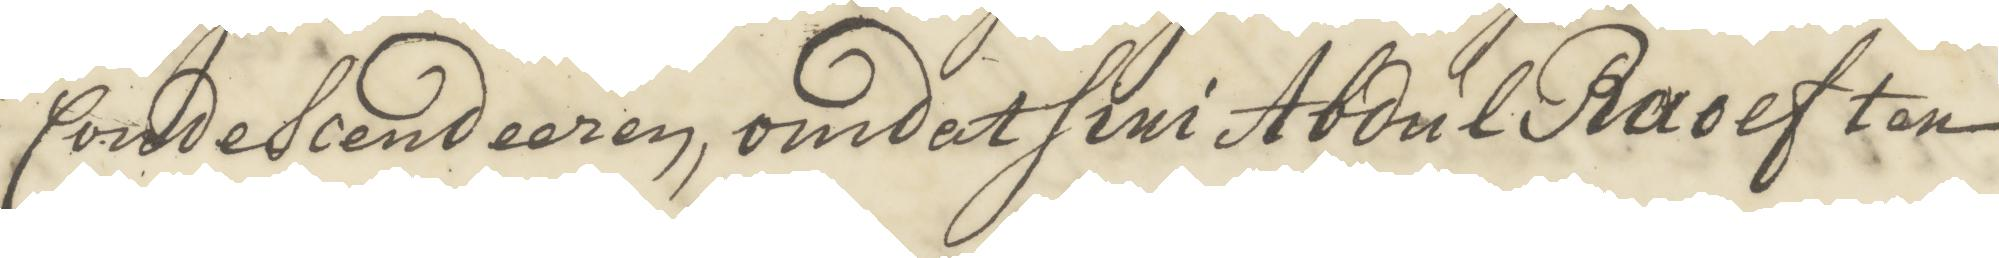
condescendeeren, omdat siri Abdul Raoef ter
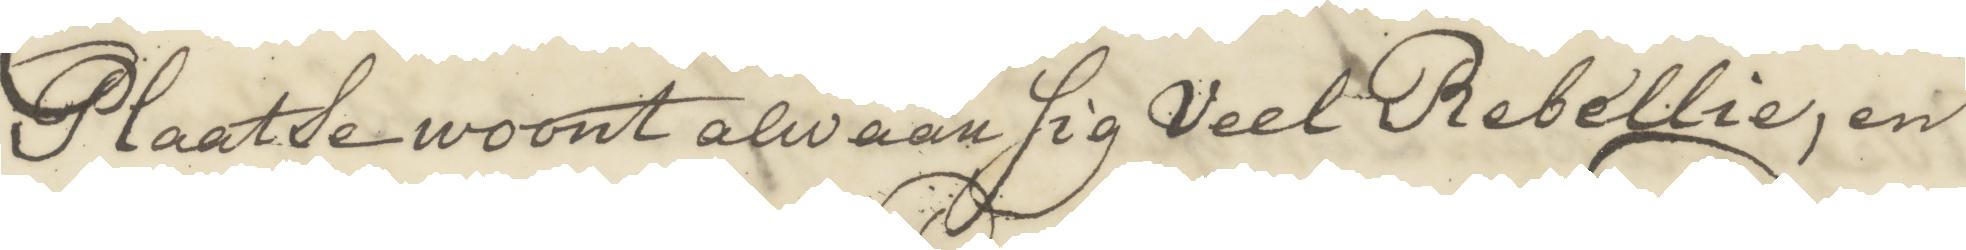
Plaatse woont alwaar sig veel Rebellie, en
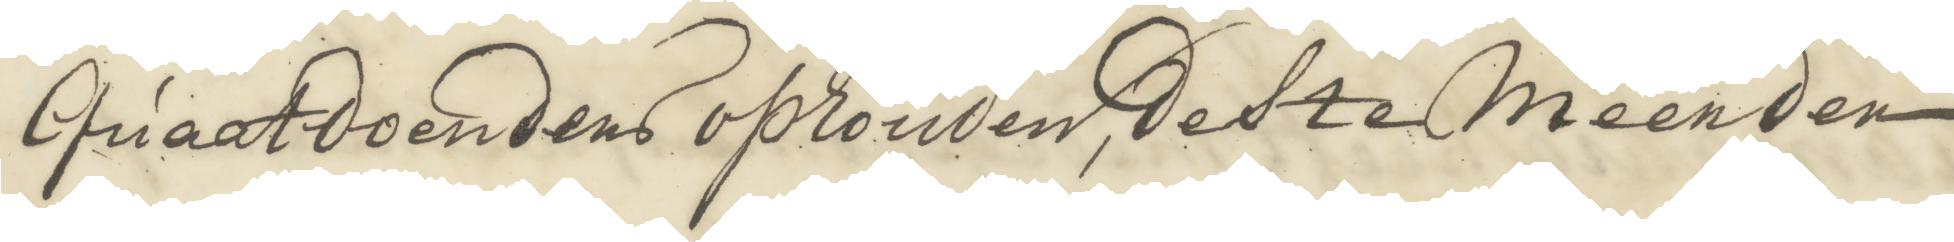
quaatdoenders ophouden, des te meerder
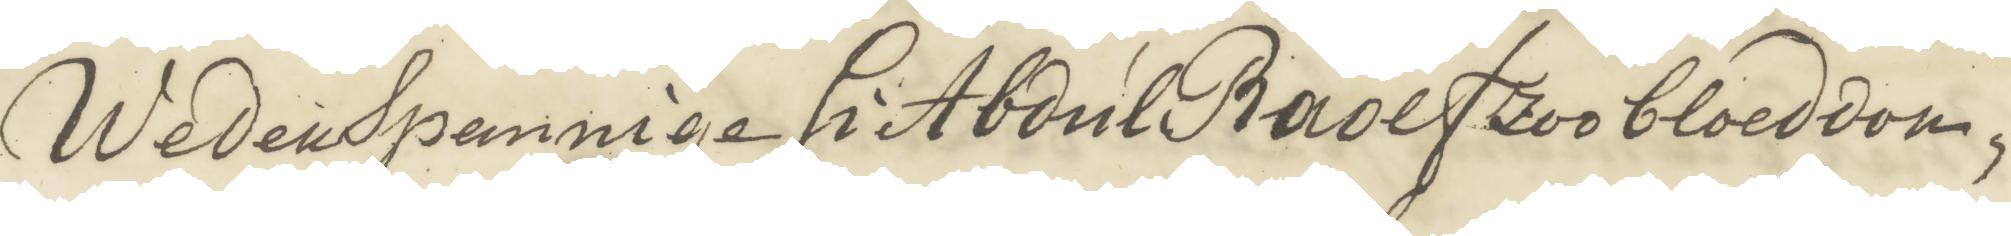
Wederspannige si Abdul Raoef zoo bloeddor„
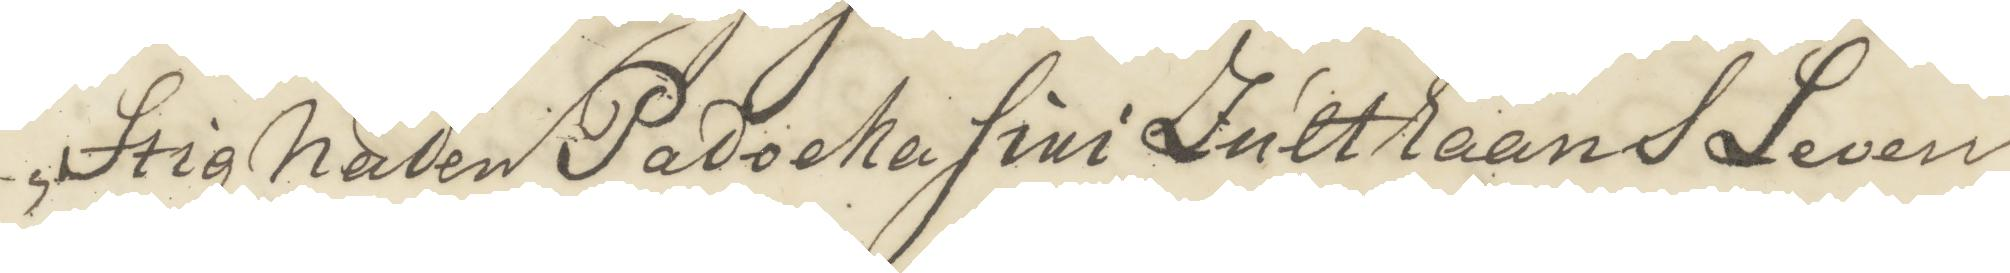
„stig na den Padoeka siri Zulthaans leven
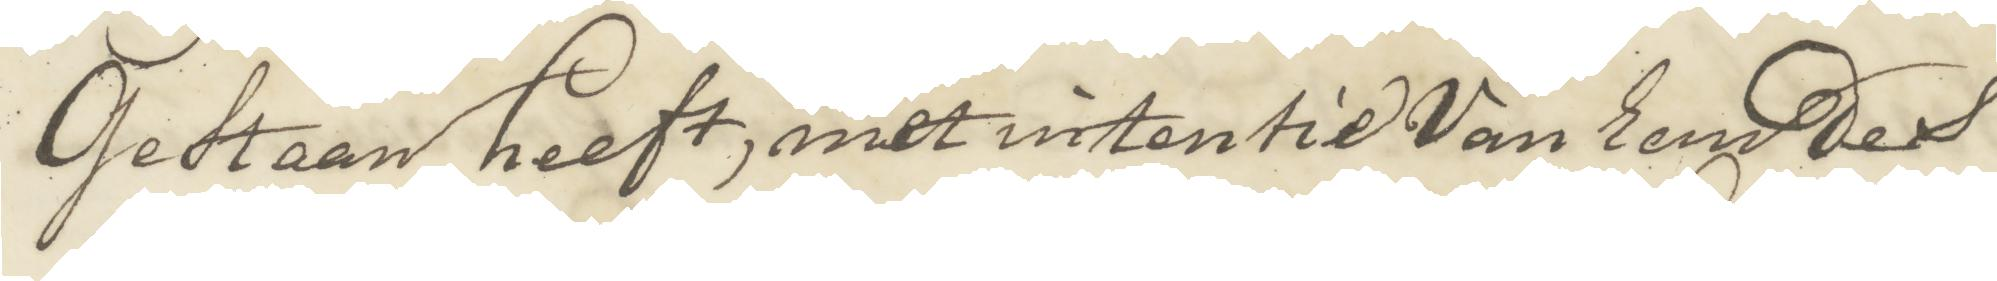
gestaan heeft, met intentie van hem des
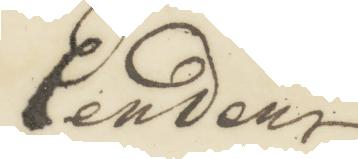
Eerders
